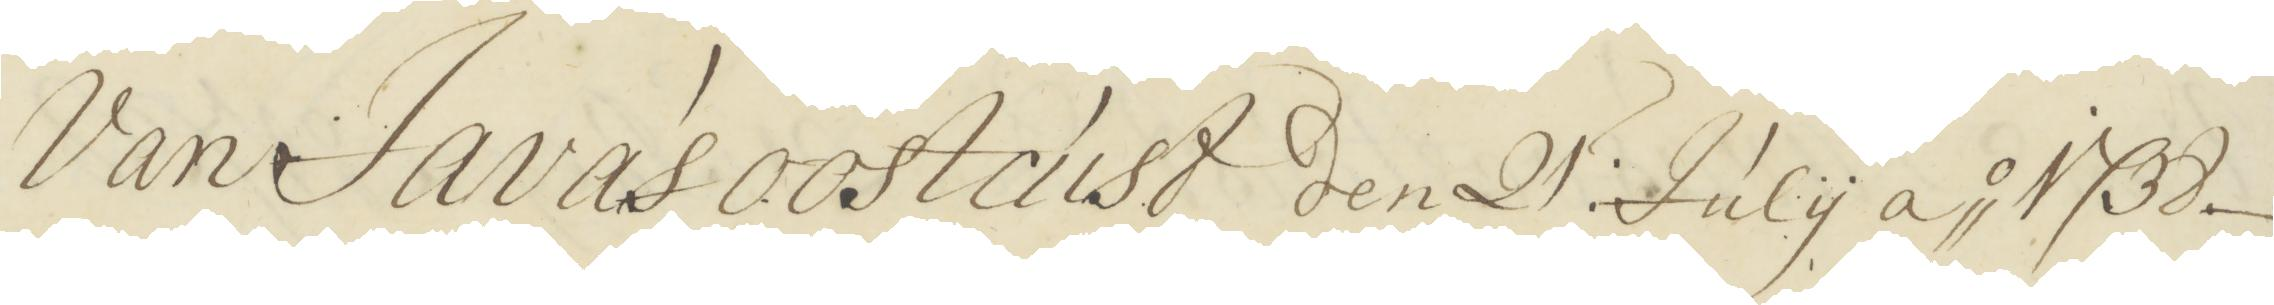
Van Iava's oostcust den 21:' Julij a„o 1738. —
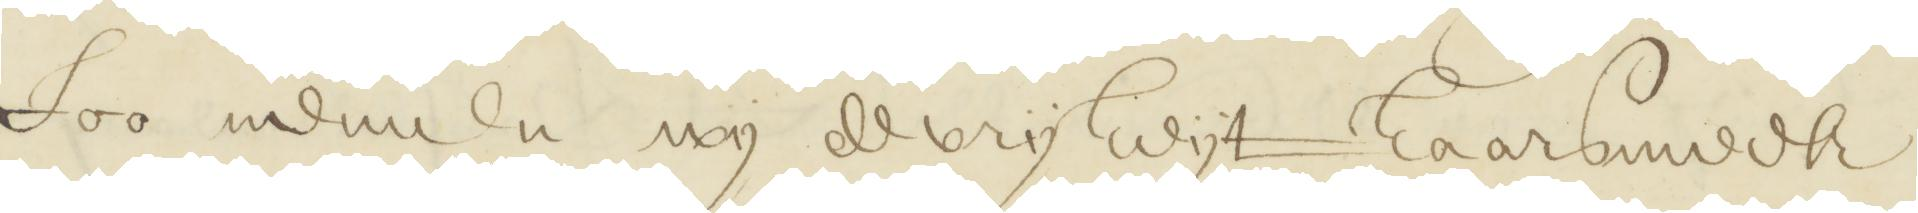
soo nemen wij de vrijheijt haarsmeek
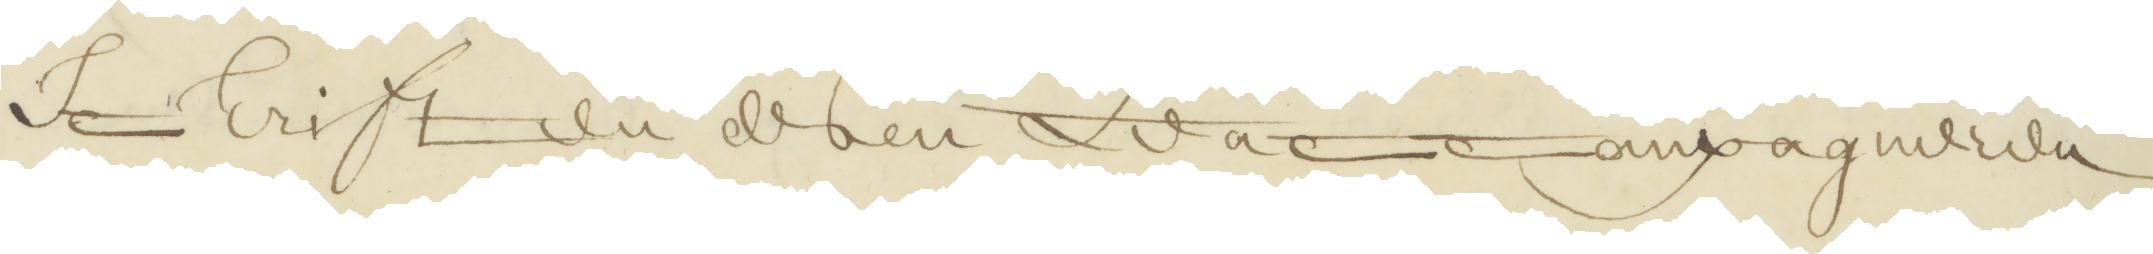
schrift en desen te accompagneren
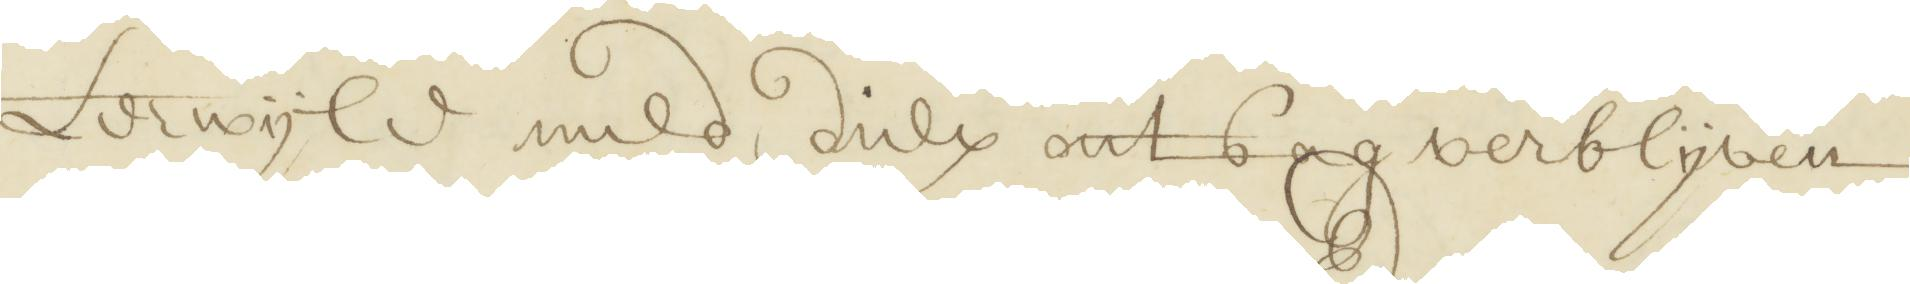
terwijle med diep ontsag verblijven
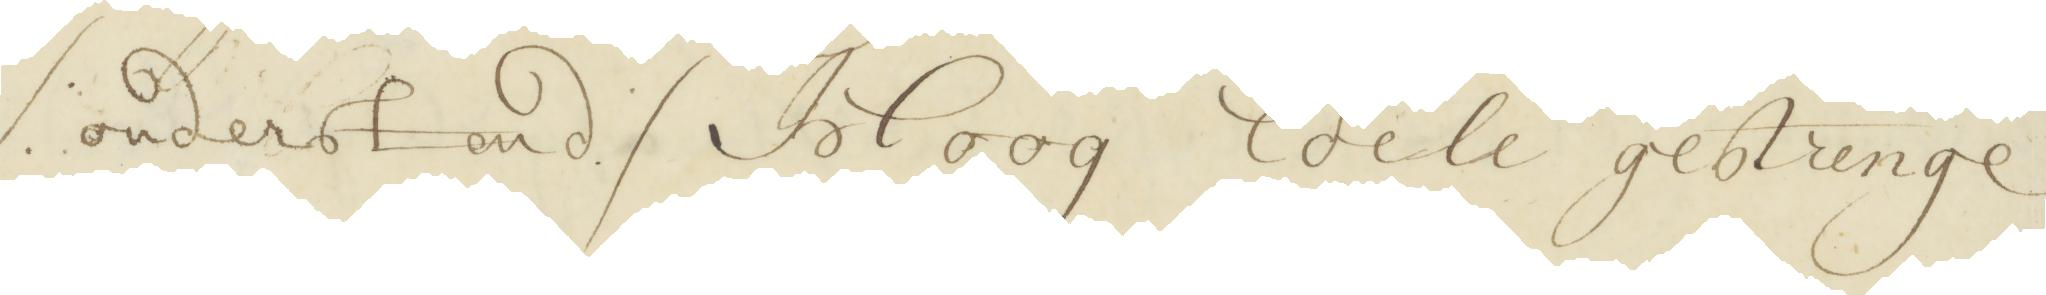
/:onderstond:/ Hoog Edele gestrenge
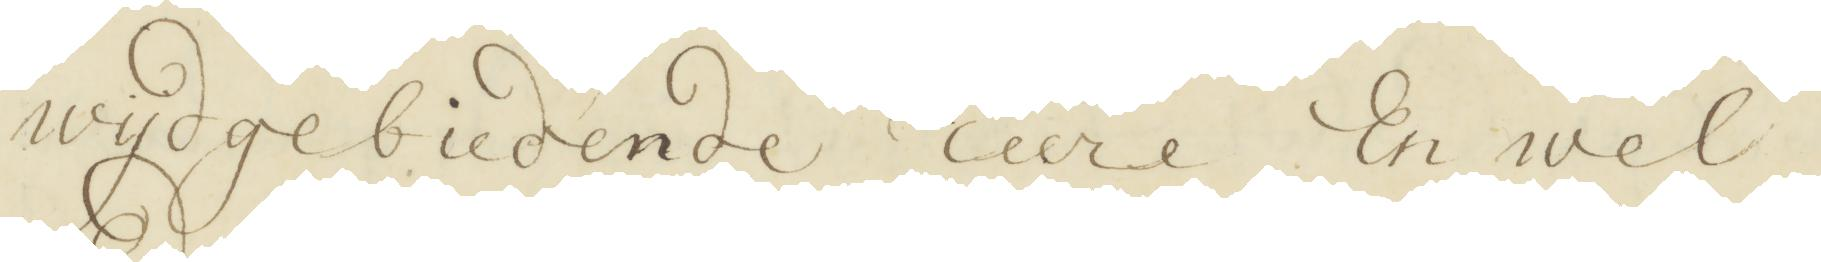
wijd gebiedende heere En wel
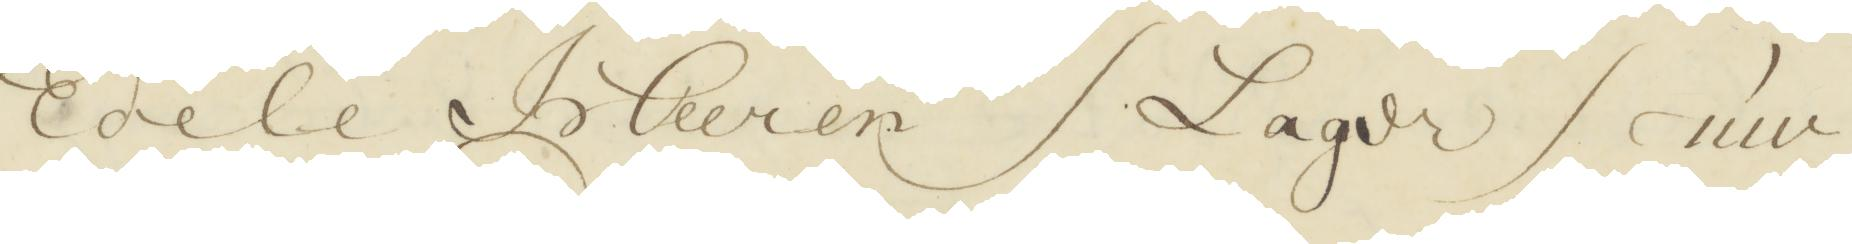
Edele Heeren /Lager/ uw
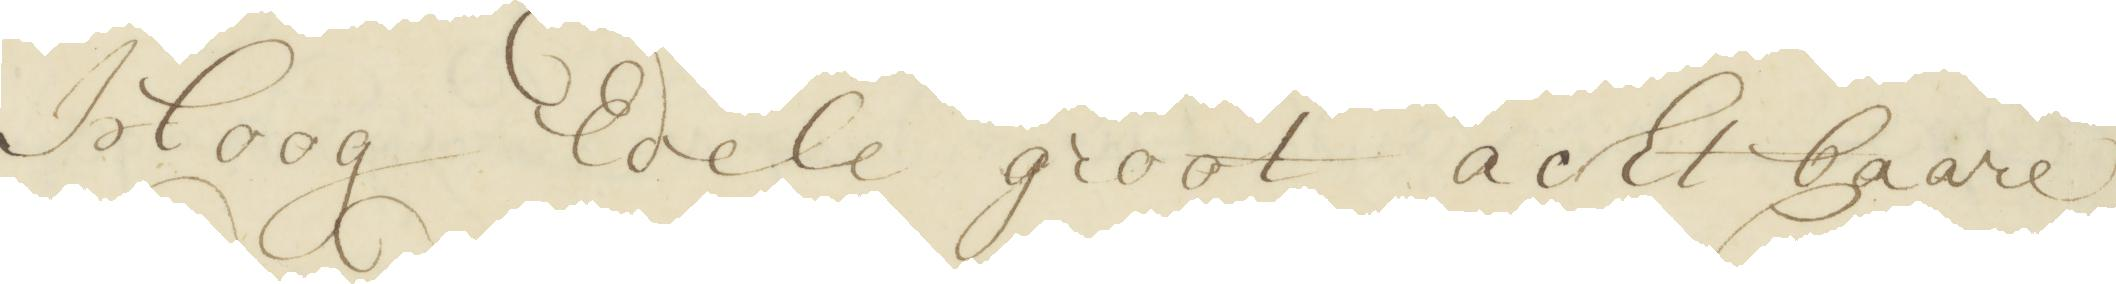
Hoog Edele groot acht baare
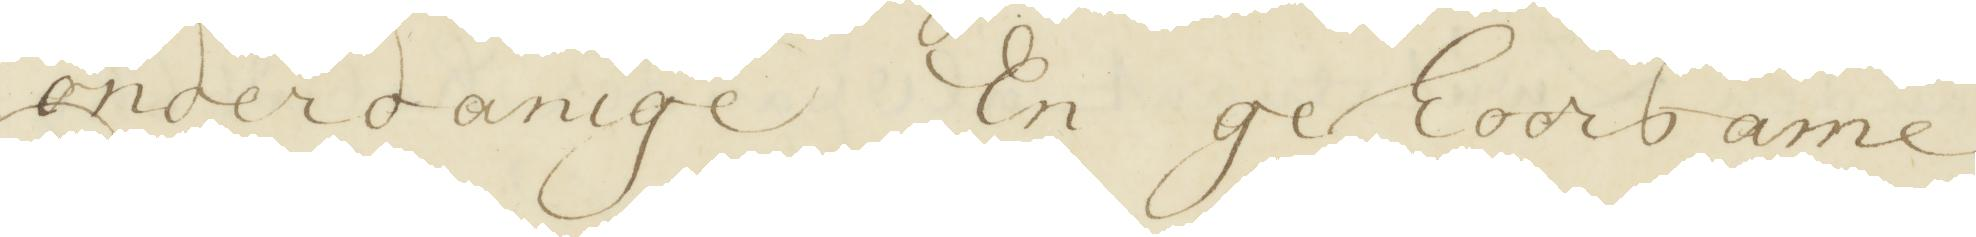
onderdanige En gehoorsame
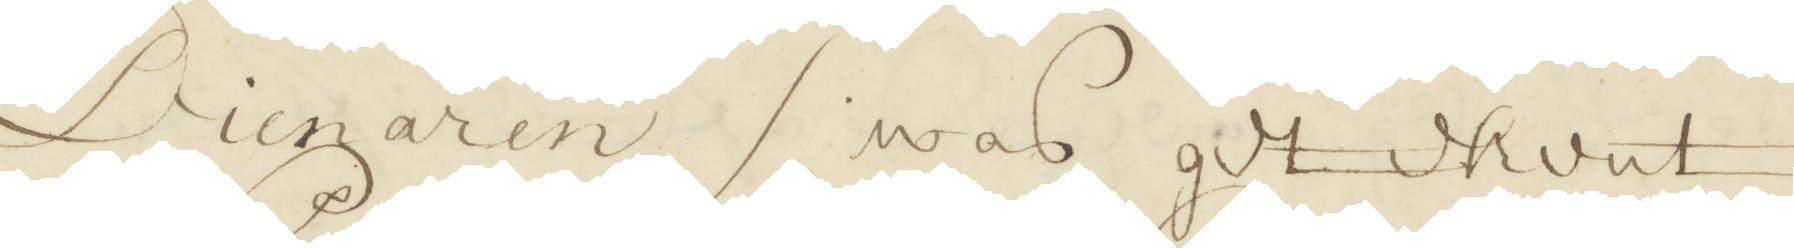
Dienaren /:was getekent
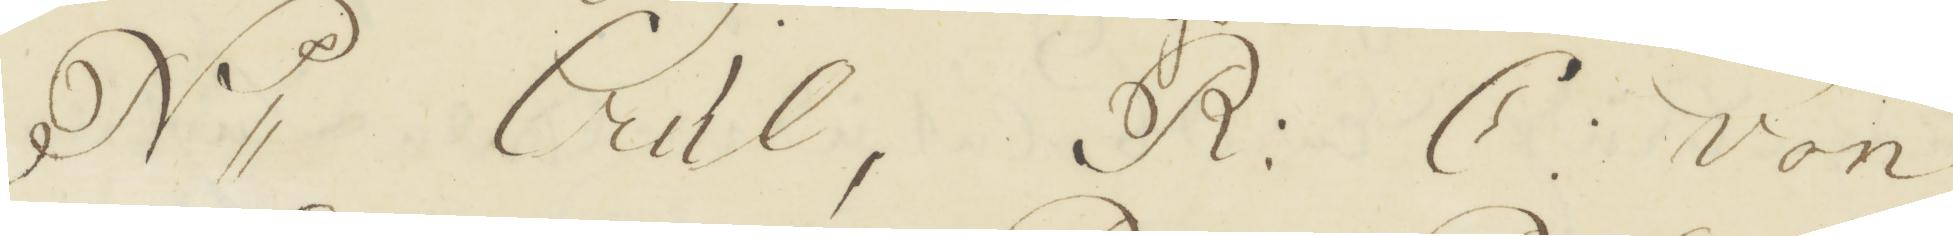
N„s Crul, R: C: von
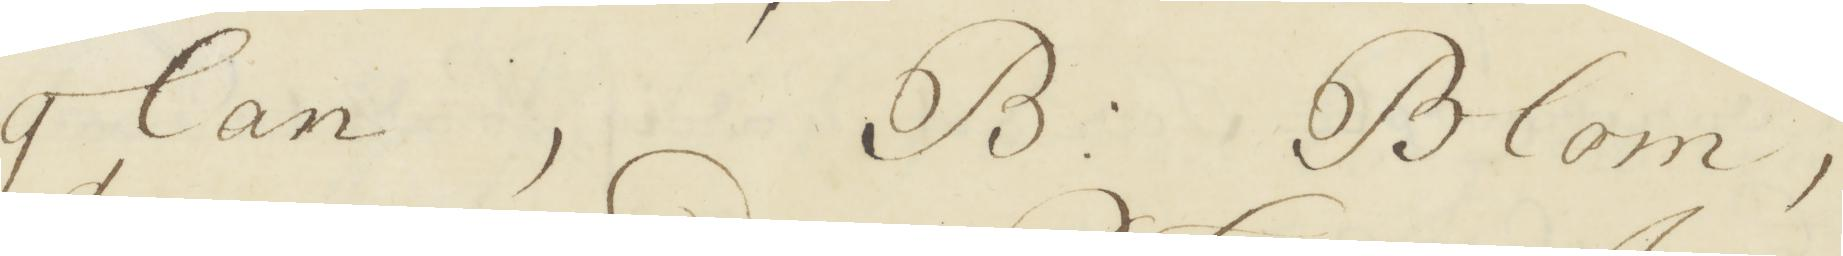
glan, B: Blom,
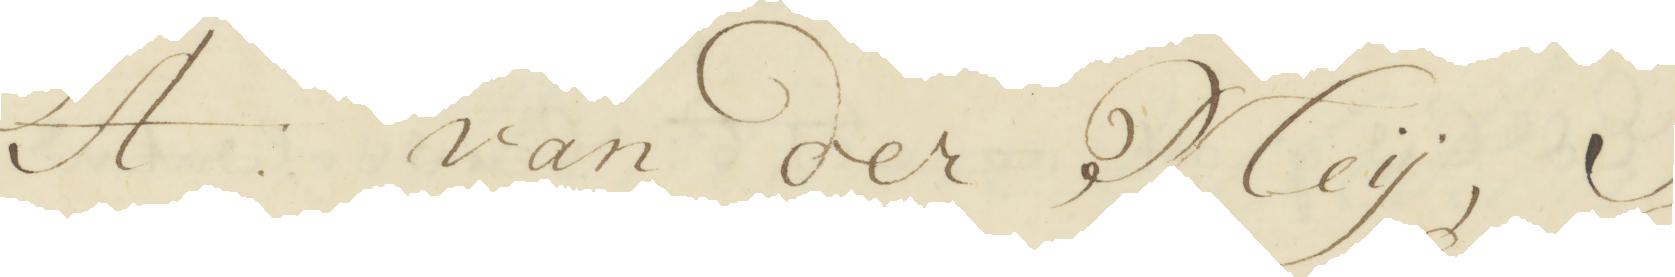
A: van der Meij, I:
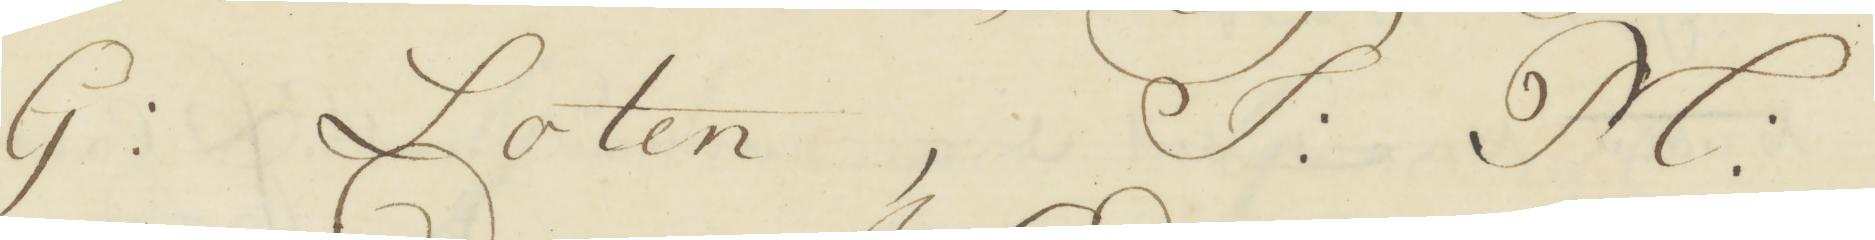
G: Loten, S: M:
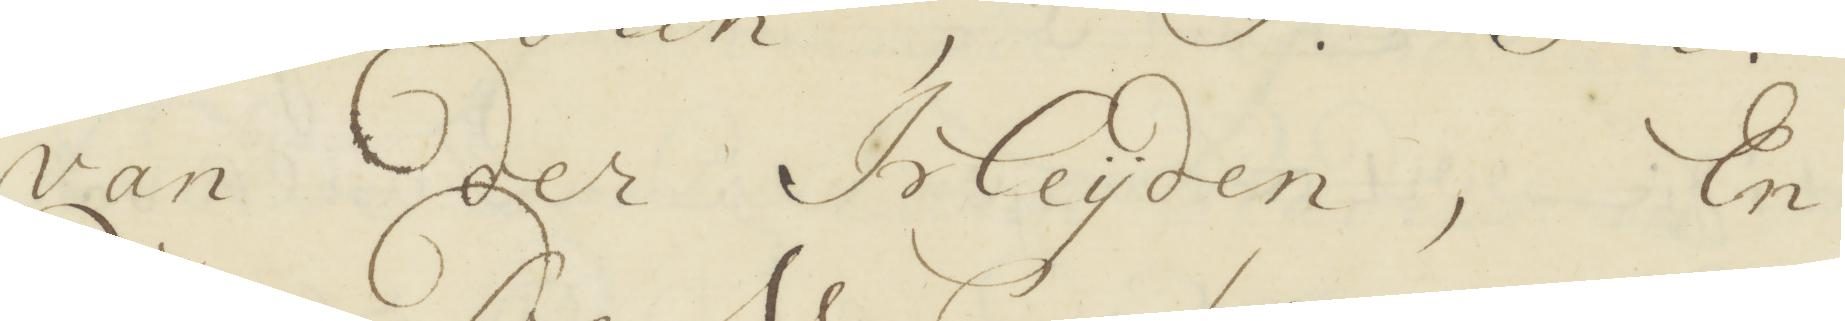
van der Heijden, En
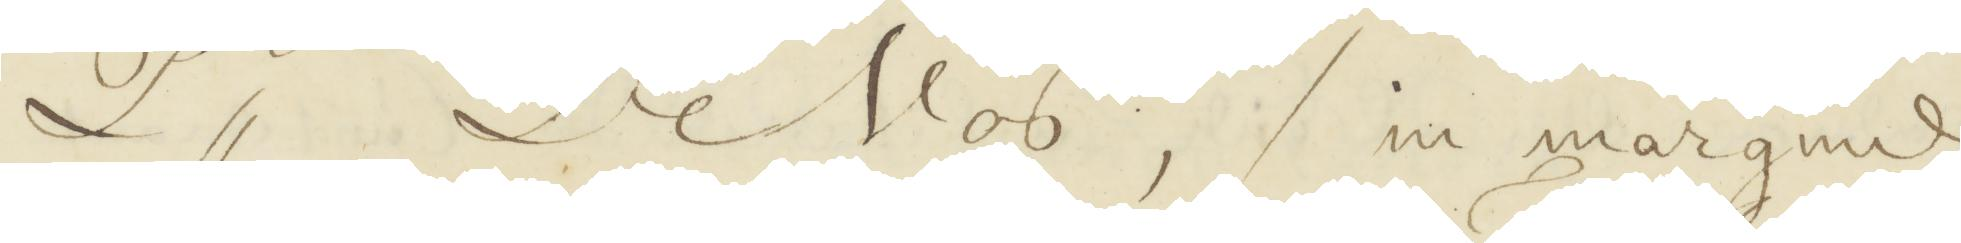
P„r De Vos, /in margine
